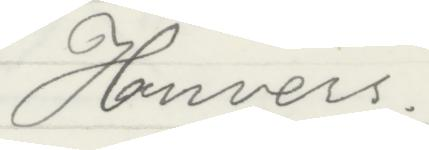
Hauvers.
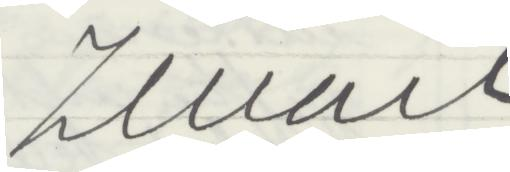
Zwart
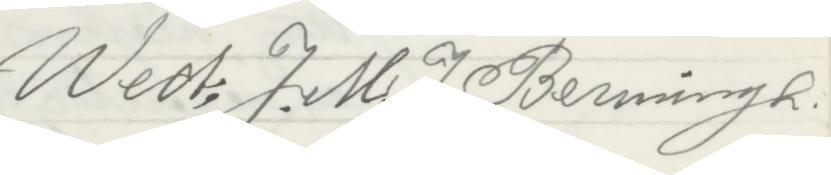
Wed, J.M.J. Beuningh
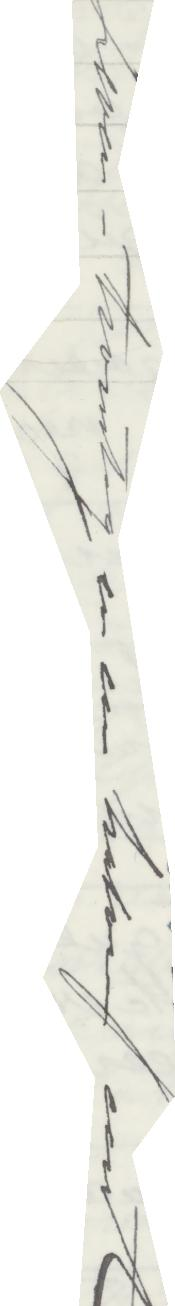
Zeven - twintig en een halven cent
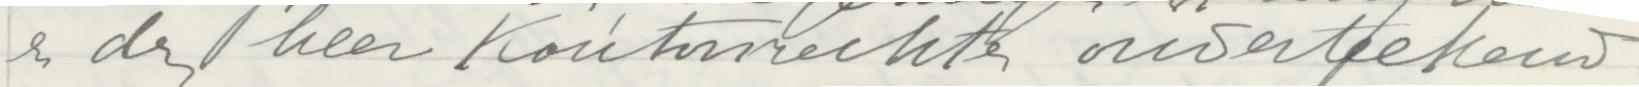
en den heer Kantonrechter onderteekend
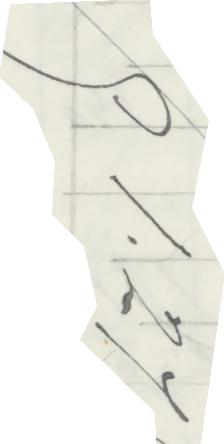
ƒ1.27/
